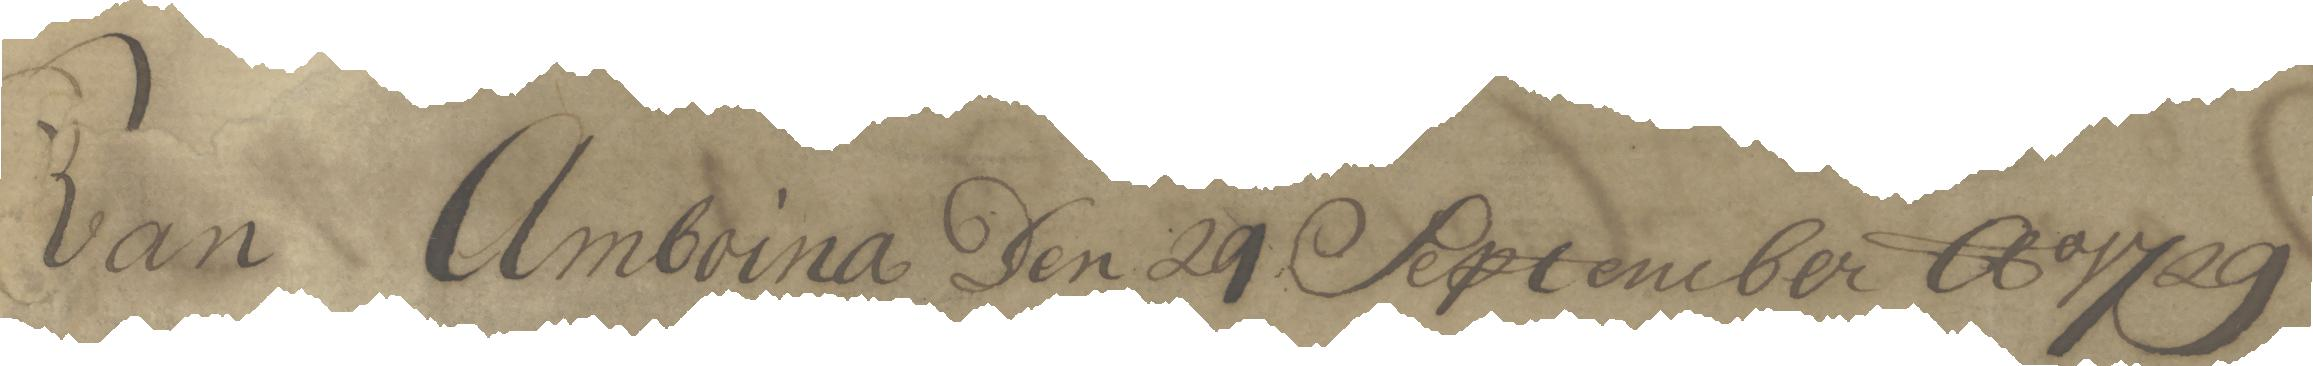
Van Amboina Den 24: September Ao 1729
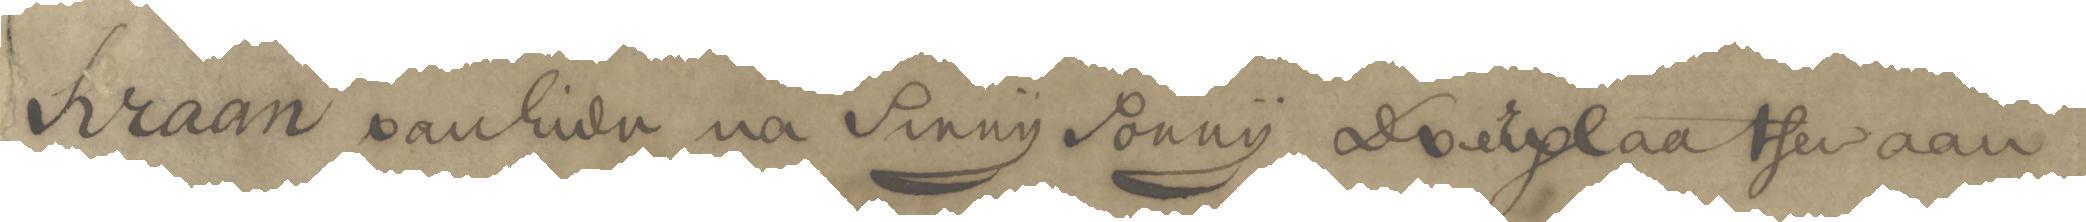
kraan van hier na sinnij sonnij te verplaatsen aan
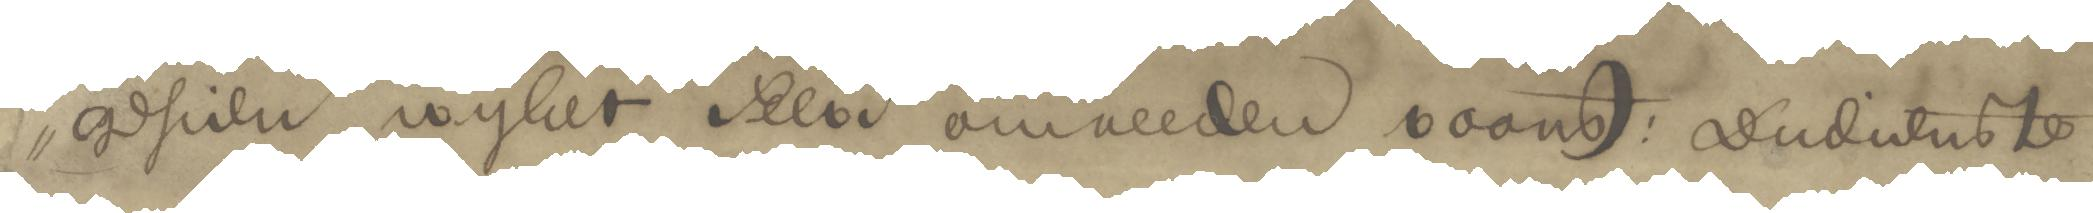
„gesien wijhet selve om reeden voorst: ten dienste
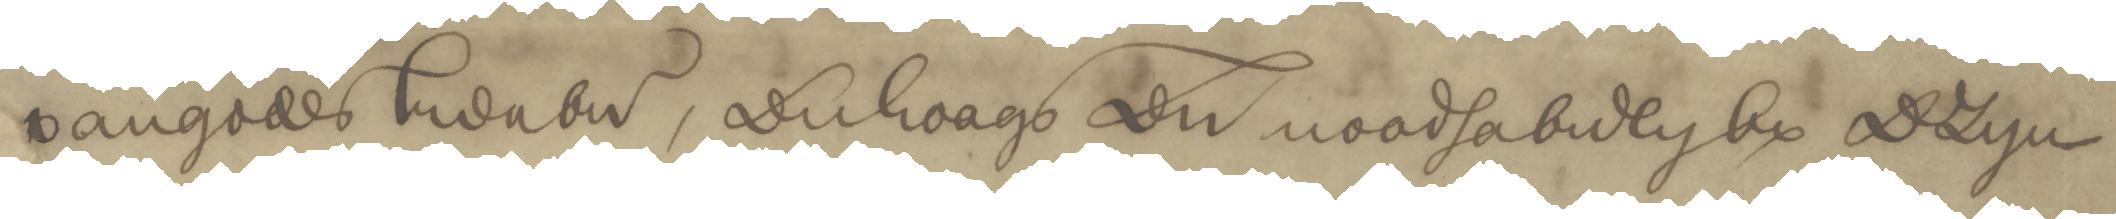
van godes kerke, ten hoogsten noodsakelijk te zyn
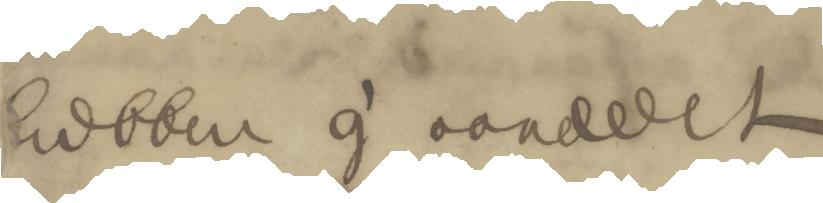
hebben g’ oordeelt
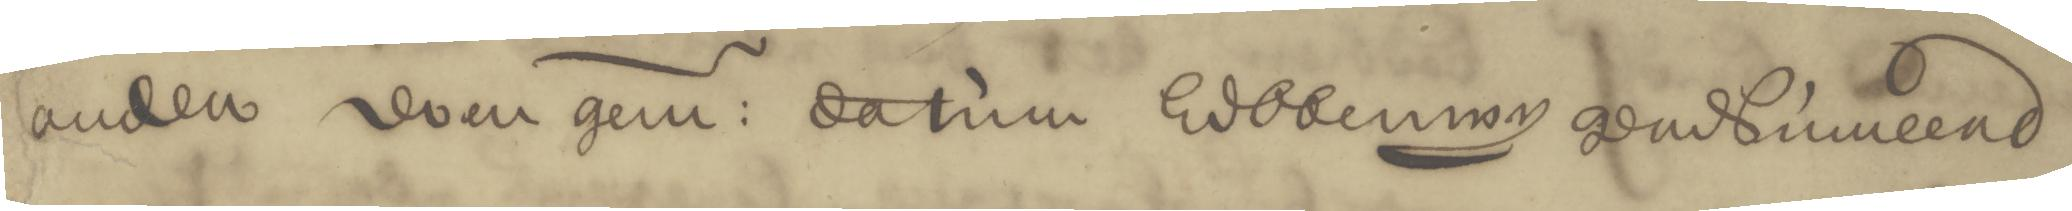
onder even gem: datum hebben wy geresumeerd
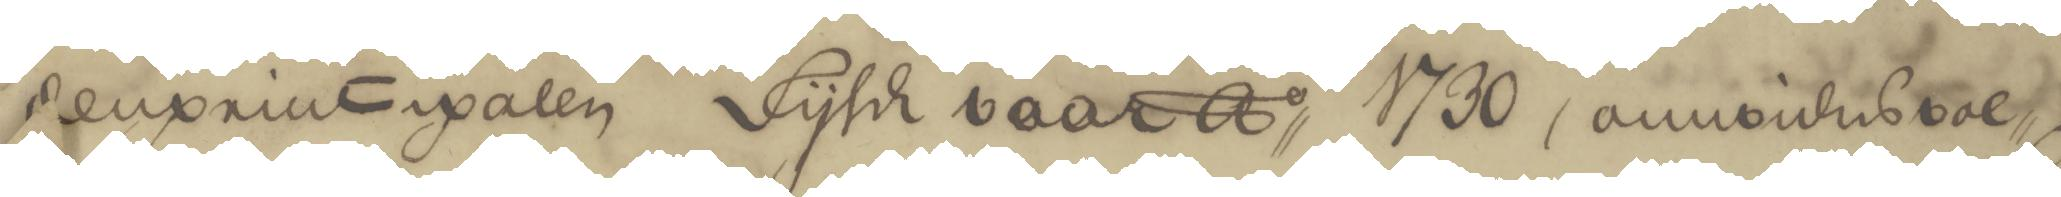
denprincipalen Eijsch vaar a„o 1730, omwiens vol„
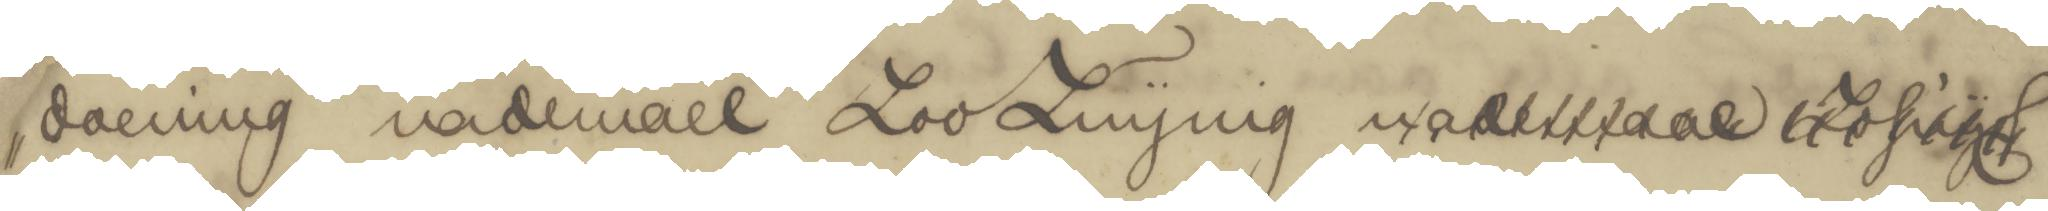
„doening nademael zoo zuijnig nademaal zo suij
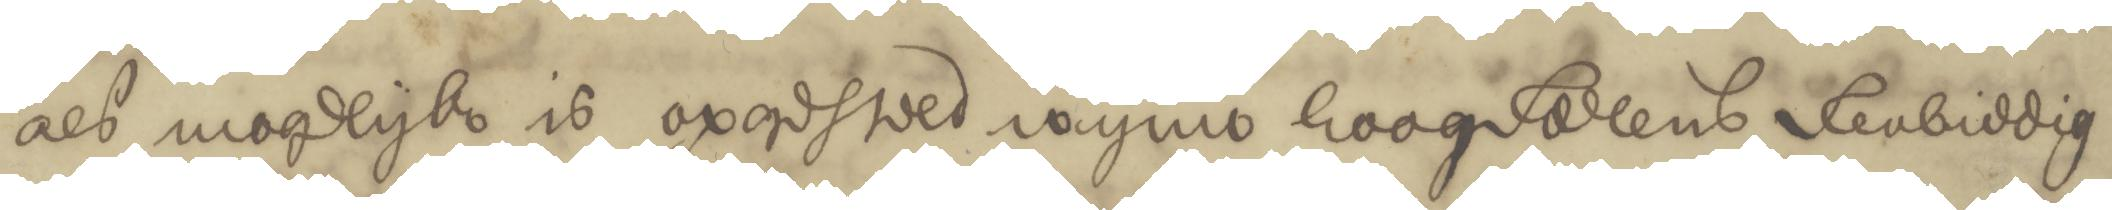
als mogelijk is opgesteld wijuw hoogEdelens Eerbiedig
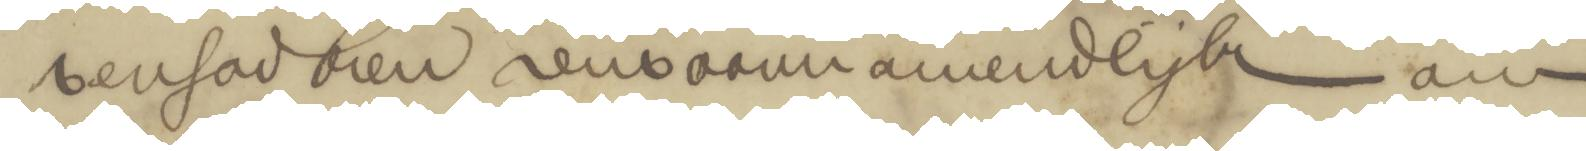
versoeken en voornamendlijk an
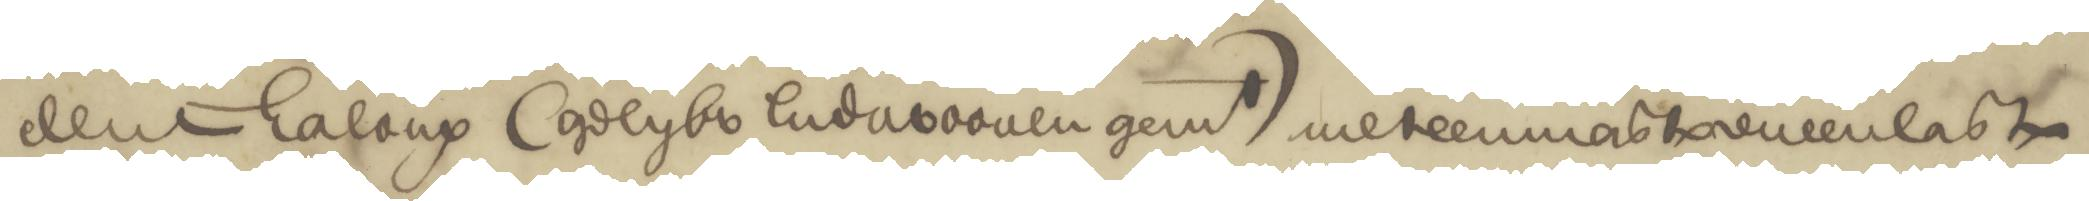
dere chaloup (gelyk hiervooren gemt) meteenmast eneen last
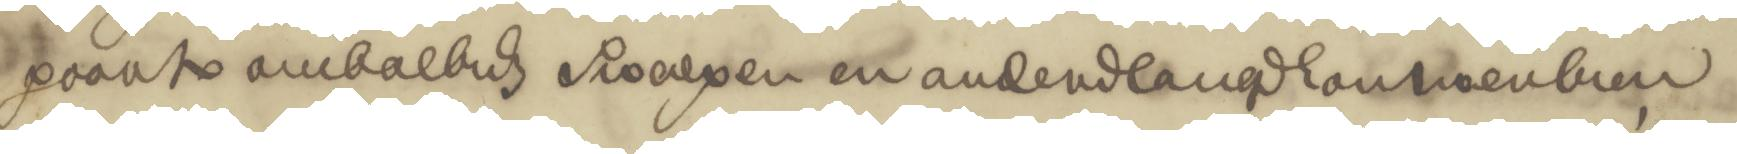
poorte ombalken swaepen en anderelange houtwerken
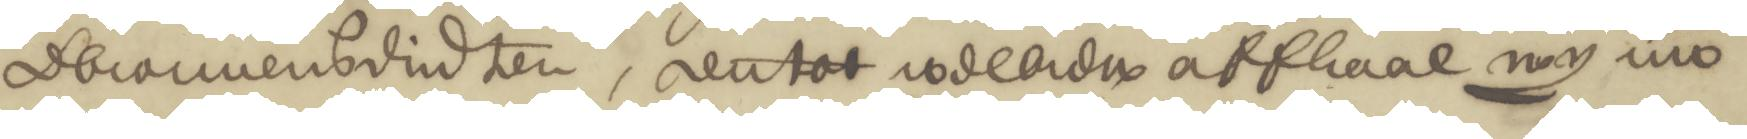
te konnen schieten, en tot welker affhaal wy uw
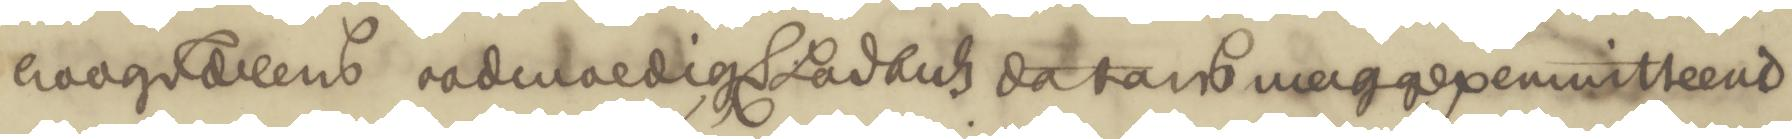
hoogedelens oodmoedig versoeken da tans mag gepermitteerd
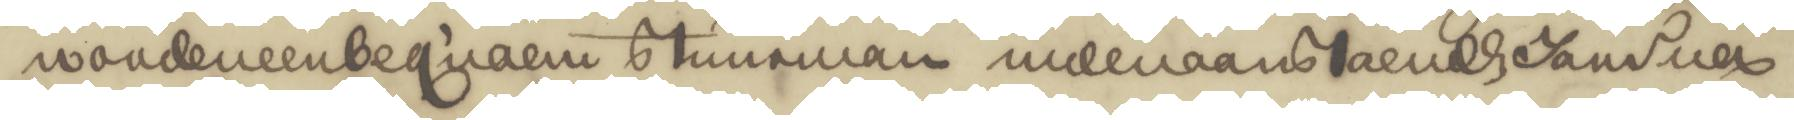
worden een bequaem stuurman in een aanstaenden Jare na
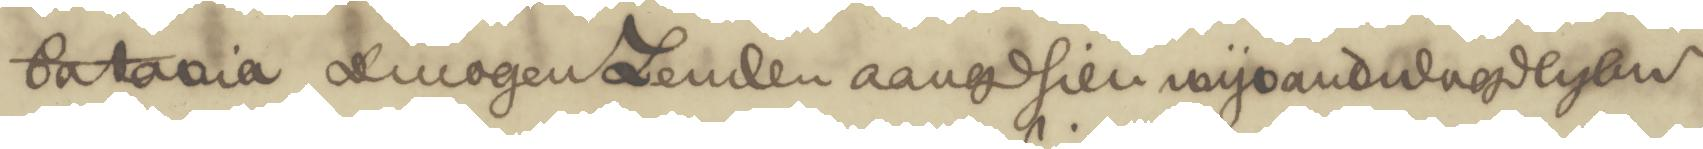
batavia te mogen zenden aangesien wijvandiergelyke
